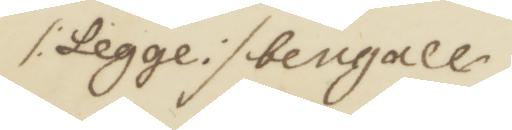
/:zegge :/ bengale
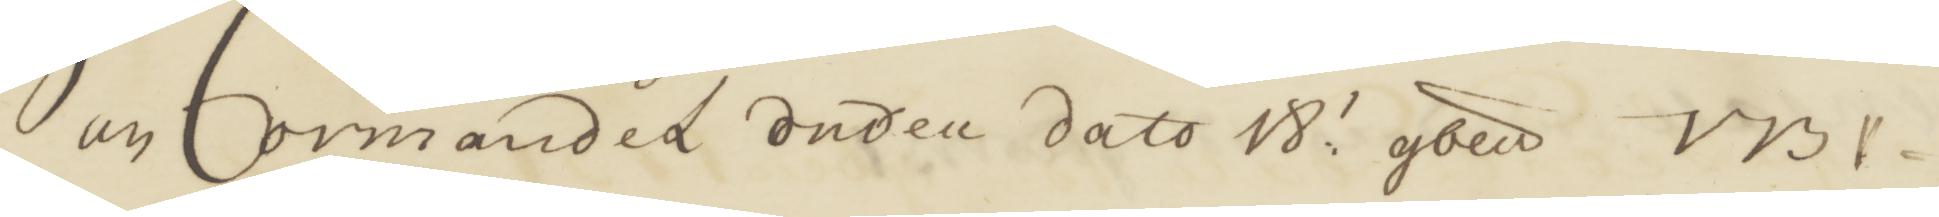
Van Cormandel onder dato 18:' 9ber 1731
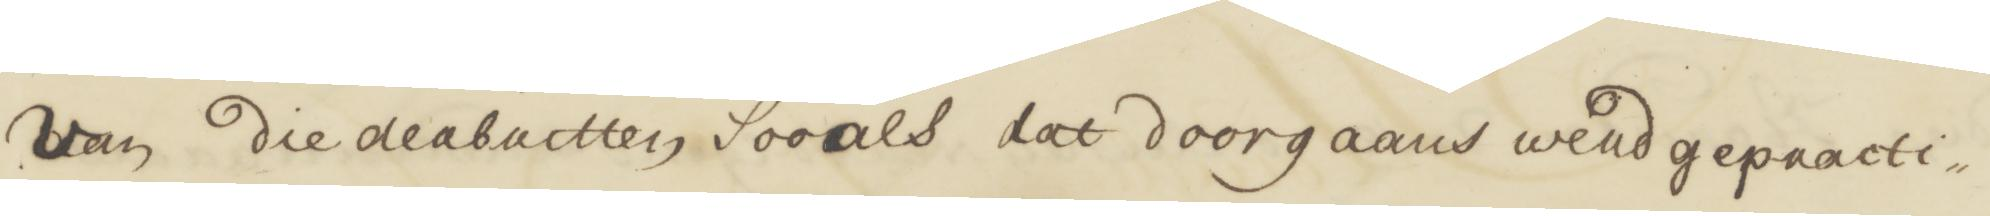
van die der britten Soo als dat doorgaans werd gepracti„
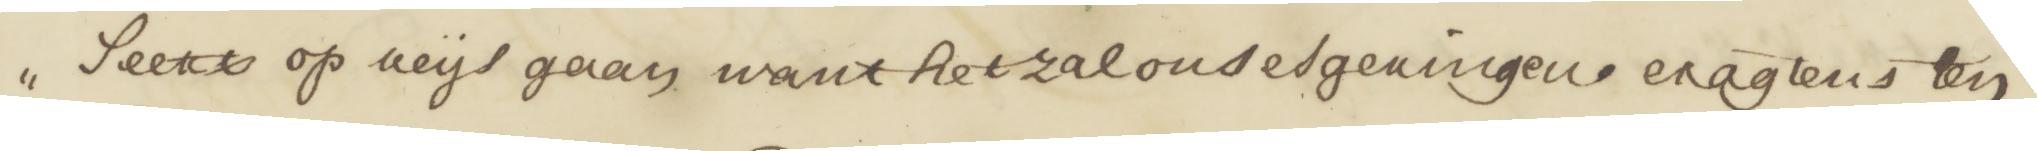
„Seert op reijs gaan want het zal onses geringen eragtens ten
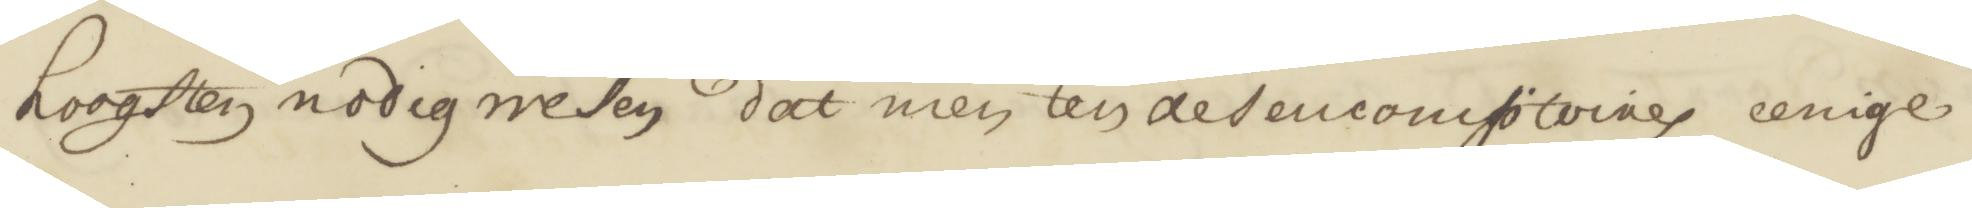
hoogsten nodig wesen dat men ten desen comptoire eenige
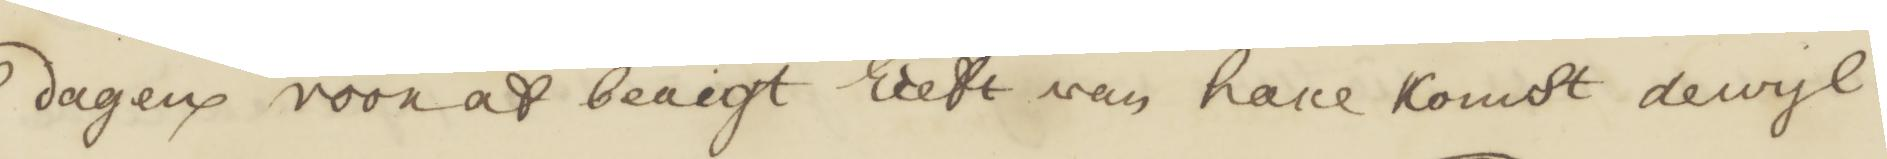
dagen voor af berigt heeft van hare komst dewijl
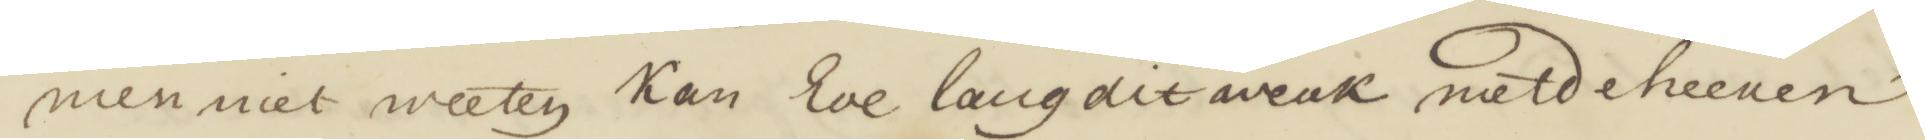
men niet weeten Kan hoe lang dit werk met de heeren
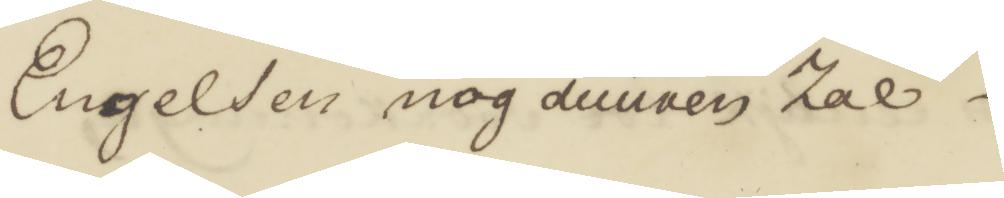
Engelsen nog duuren Zal
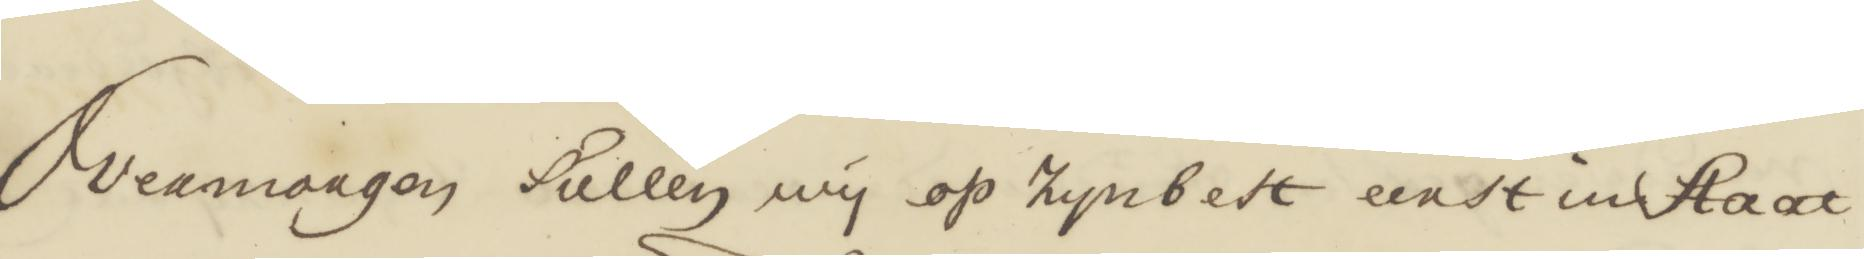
Overmorgen sullen wij op Zyn best eerst in Staat
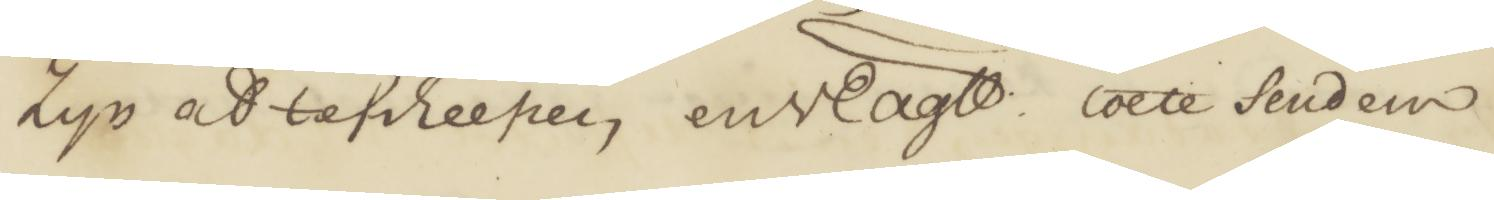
Zyn af te Scheepen en VE agtb: toete Senden
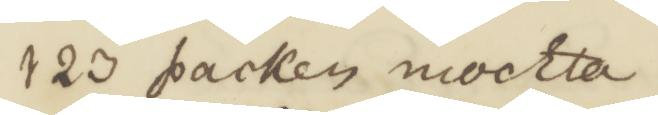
123 packen mochta }
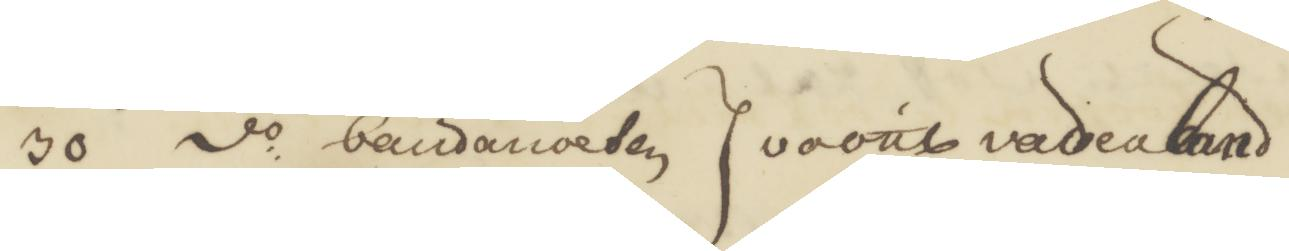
30 d:o bandanoesen } voort vaderland
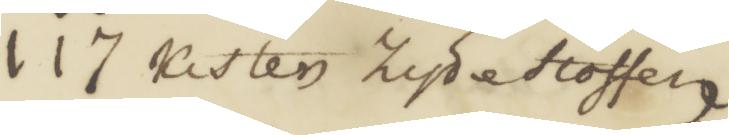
117 kisten Zyde stoffen }
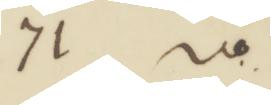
71 do „ „ Iapan
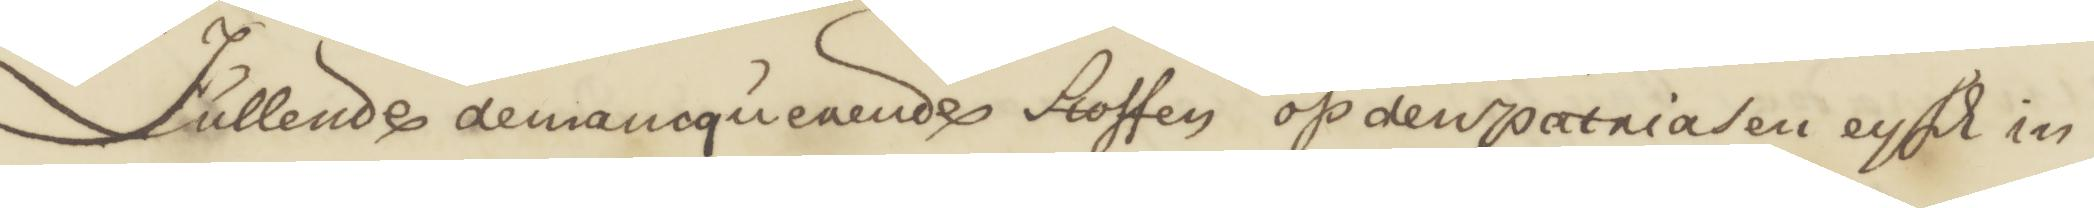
Zullende demancquerende stoffen op den patriasen eysch in
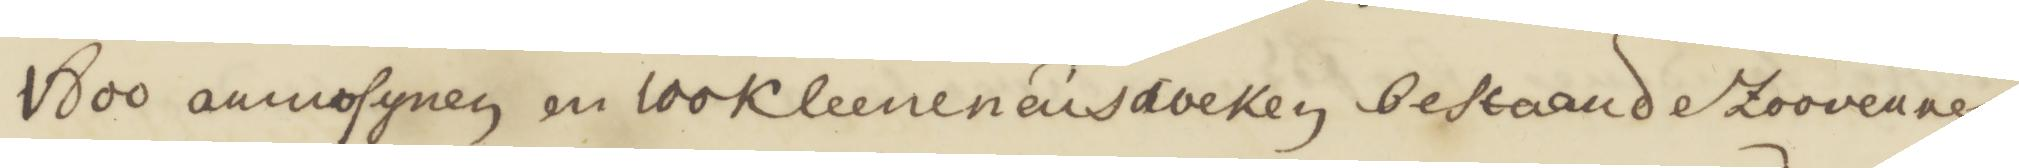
1800 armosynen en 100 Kleenen neusdoeken bestaande Zooverre
